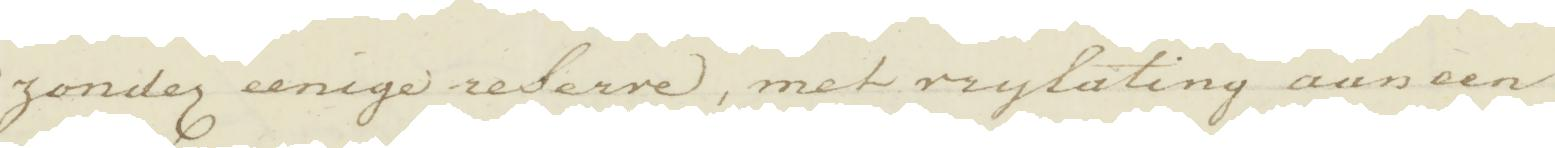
zonder eenige reserve, met vrylating aan een
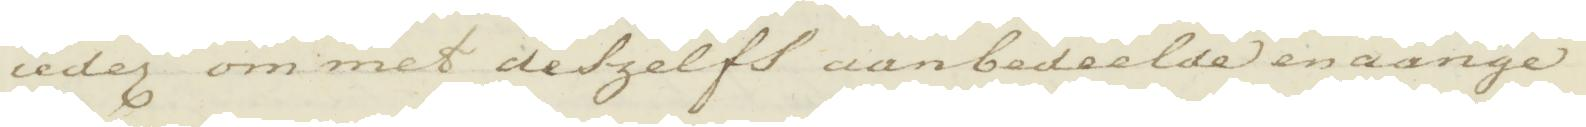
ieder om met deszelfs aanbedeelde en aange
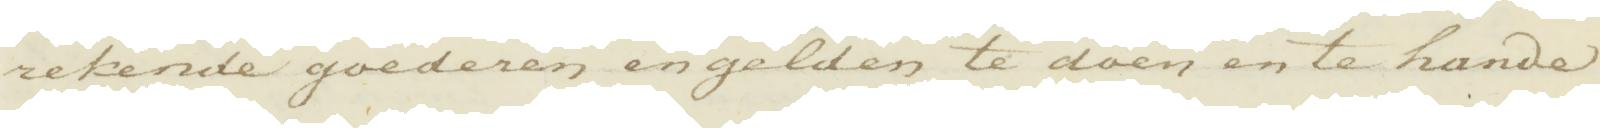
rekende goederen en gelden te doen en te hande
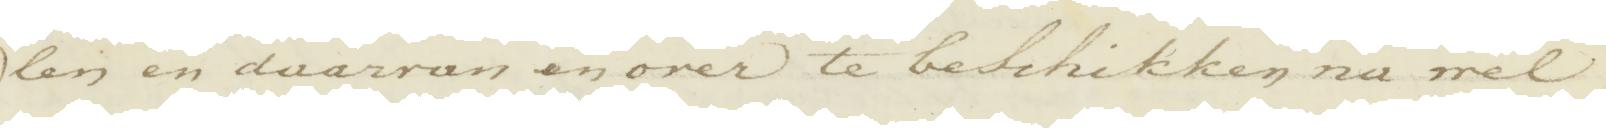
len en daarvan en over te beschikken na wel
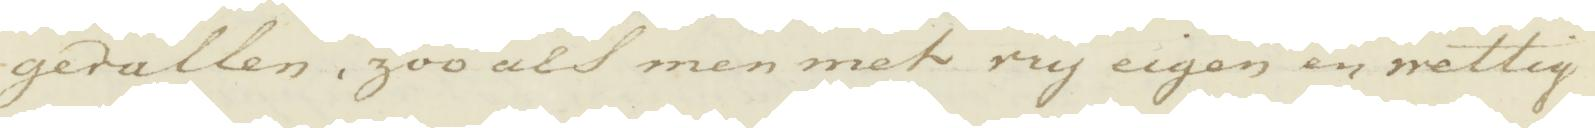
gevallen, zoo als men met vry eigen en wettig
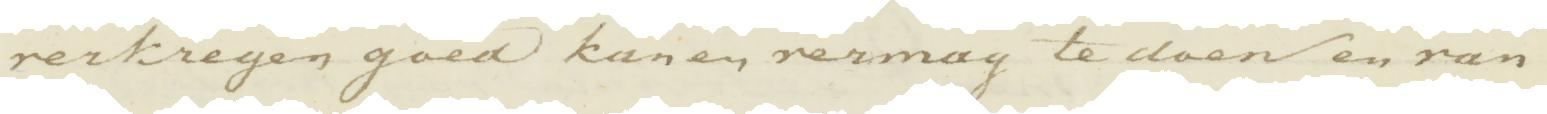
verkregen goed kan en vermag te doen en van
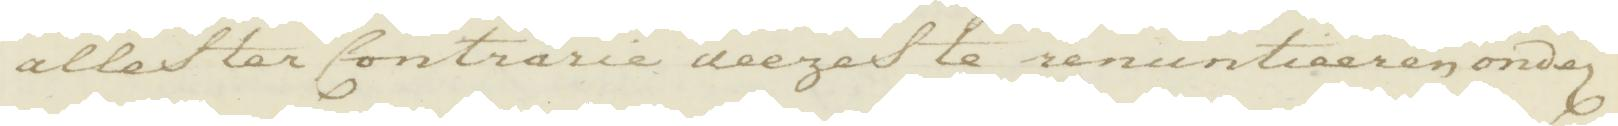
alles ter Contrarie deezes te renuntieeren onder
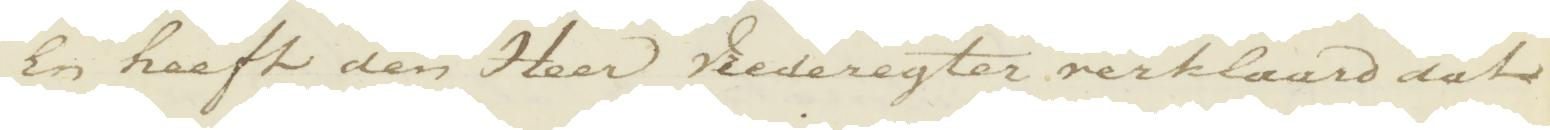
En heeft den Heer Vrederegter verklaard dat
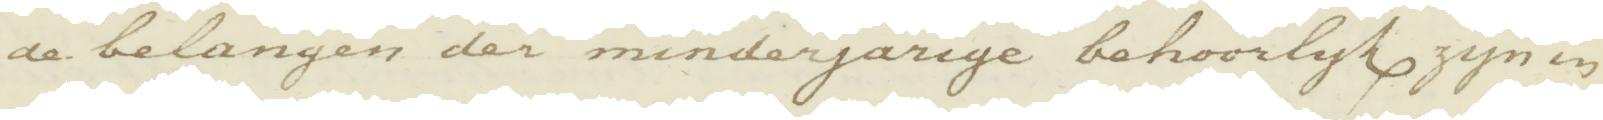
de belangen der minderjarige behoorlyk zyn in
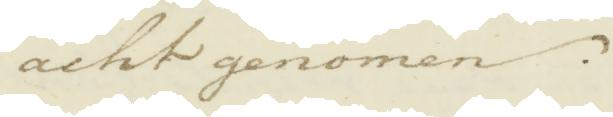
acht genomen.
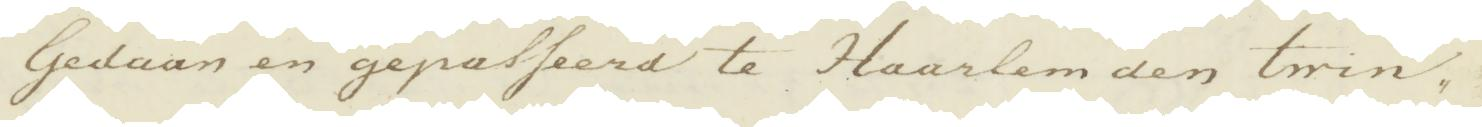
Gedaan en gepasseerd te Haarlem den twin„
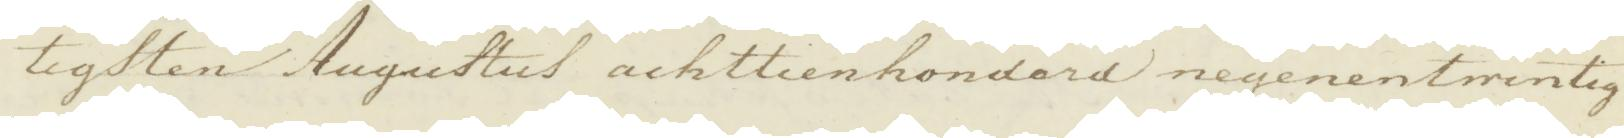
tigsten Augustus achttienhonderd negenentwintig
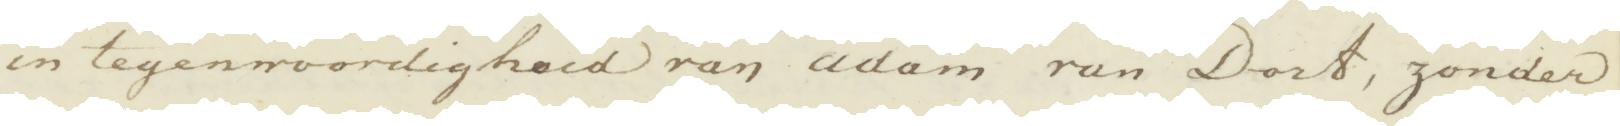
in tegenwoordigheid van adam van Dort, zonder
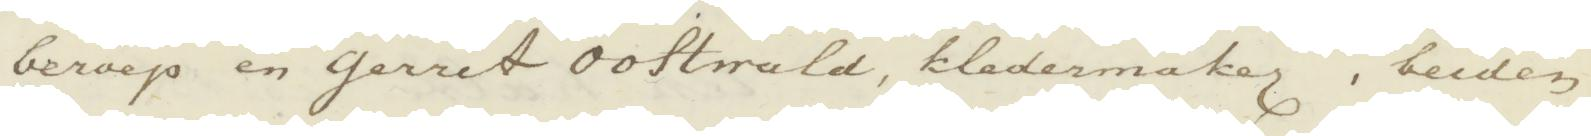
beroep en gerrit Oostwald, kledermaker , beiden
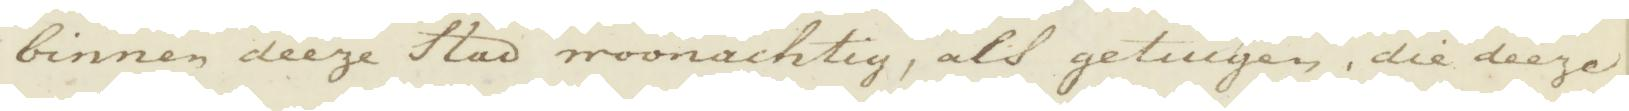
binnen deeze stad woonachtig, als getuigen, die deeze
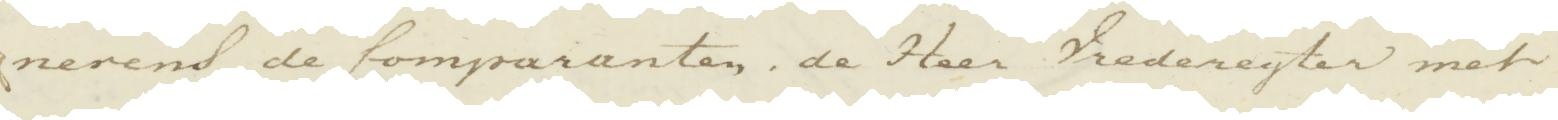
nevens de Comparanten, de Heer Vrederegter met
